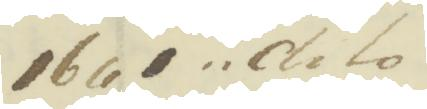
164 1 „ dito
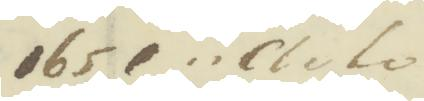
165 1 „ dito
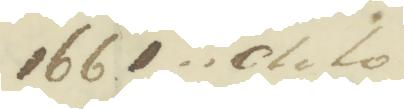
166. 1 „ dito
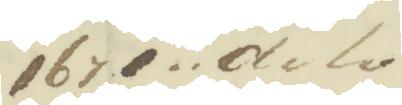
167. 1 „ dito
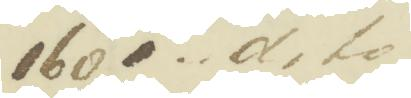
168. 1 „ dito
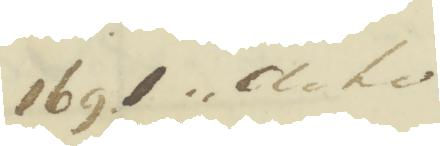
169. 1 „ dito
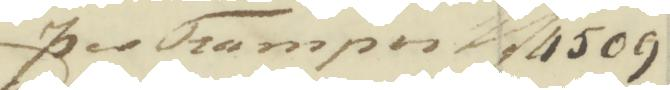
Per Transport ƒ 4509
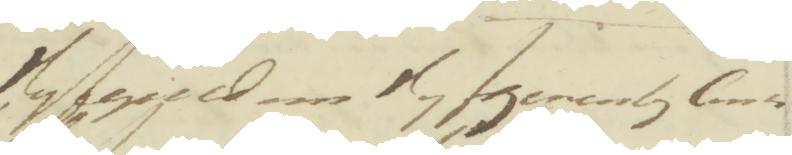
Vyf guldens Vyfenzeventig Cent
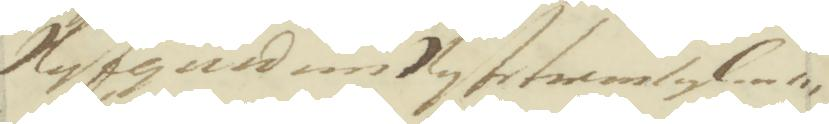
Vyf guldens Vyfentwintig Cent „
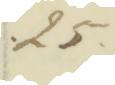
. 25
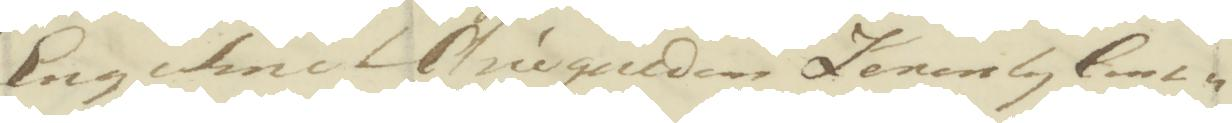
Engesmit Drie guldens Zeventig Cent „
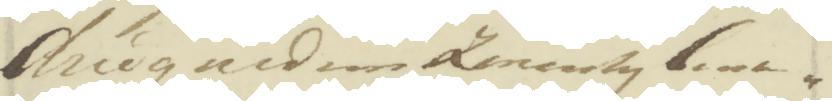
Drie guldens zeventig Cent „
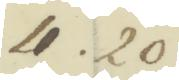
4. 20
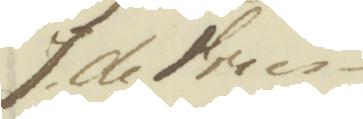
J. de Vries —
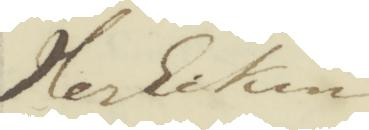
Vereiken
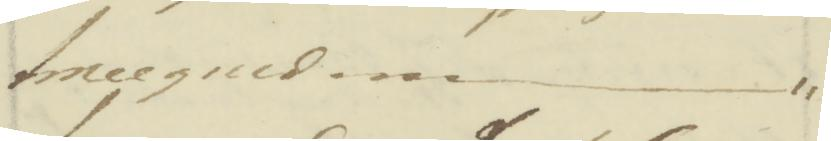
twee guldens „
